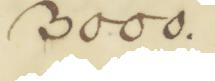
3000.
